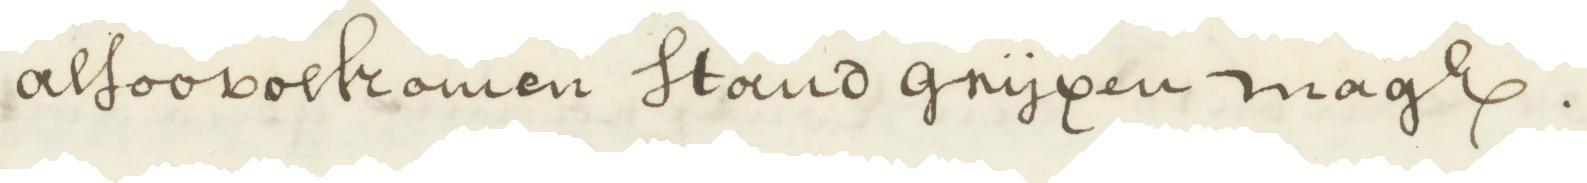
alsoo volkomen stand grijpen magh.
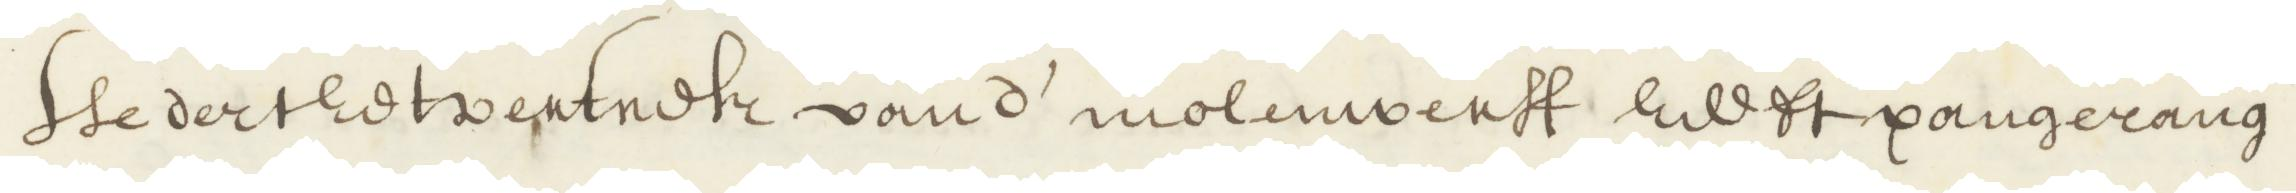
'tse derthetvertrek van d’ molenwerff heeft pangerang
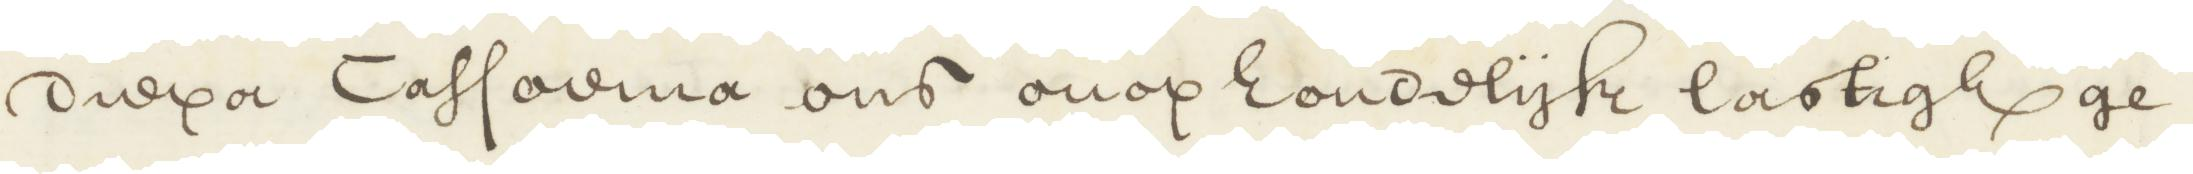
diepa Cassoema ons onop houdelijk lastigh ge
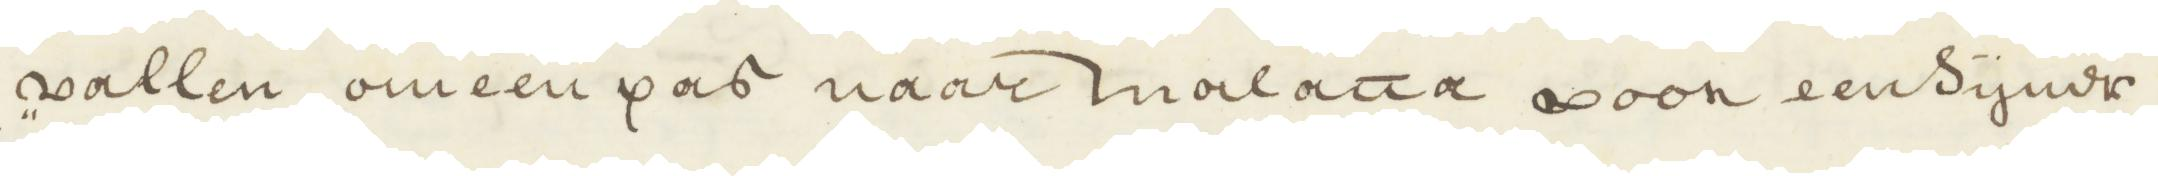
„vallen, om een pas naar Malacca voor een sijner
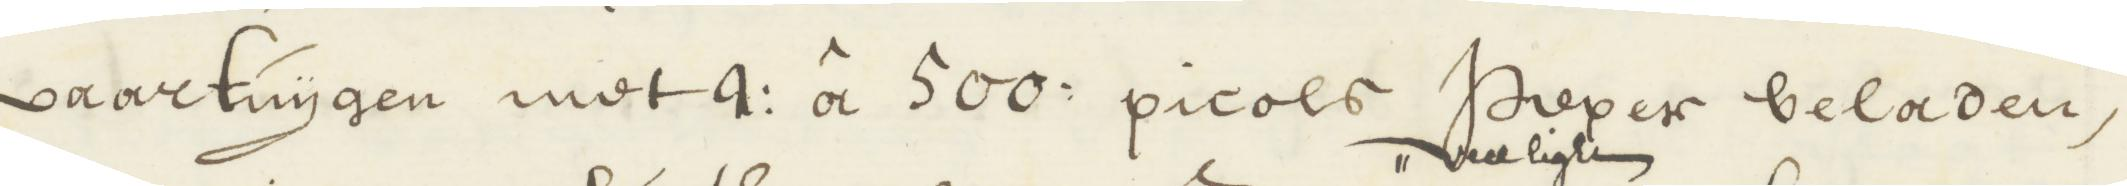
vaartuijgen met 4: â 500: picols Peper beladen,
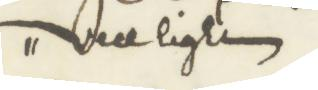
„ Wellight
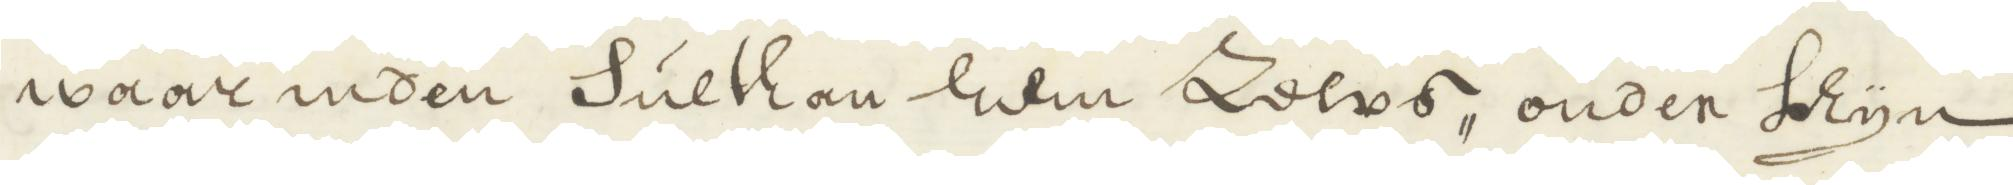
waar inden sulthan hem zelvs „ onder schijn
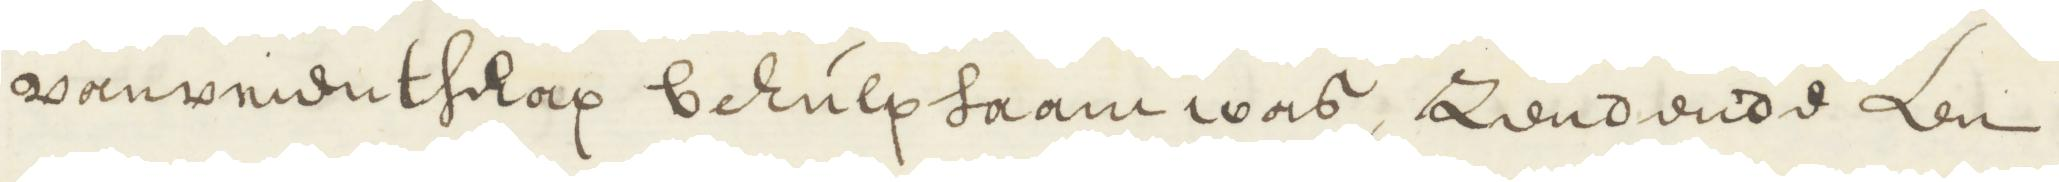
van vrientschap behulpsaam was, zendende ten
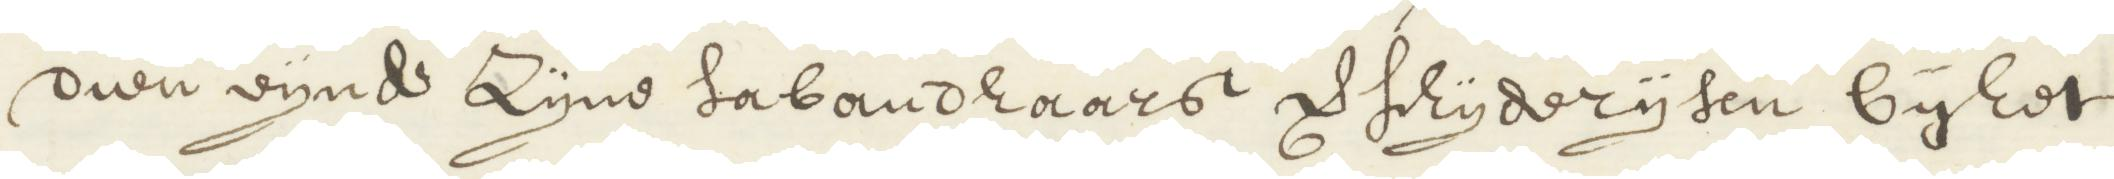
dien eijnde zijne sabandhaars verschij derijsen bijhet
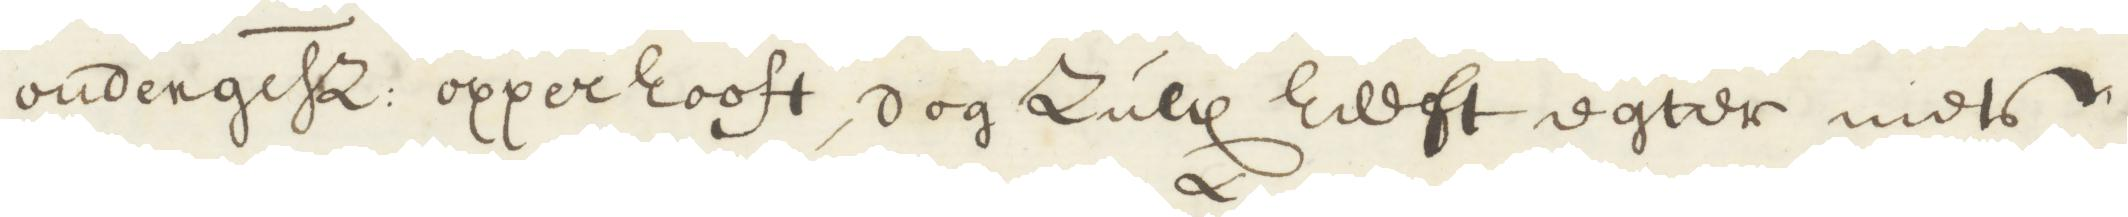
ondergesz: opperhooft, dog zulx heeft egter niets
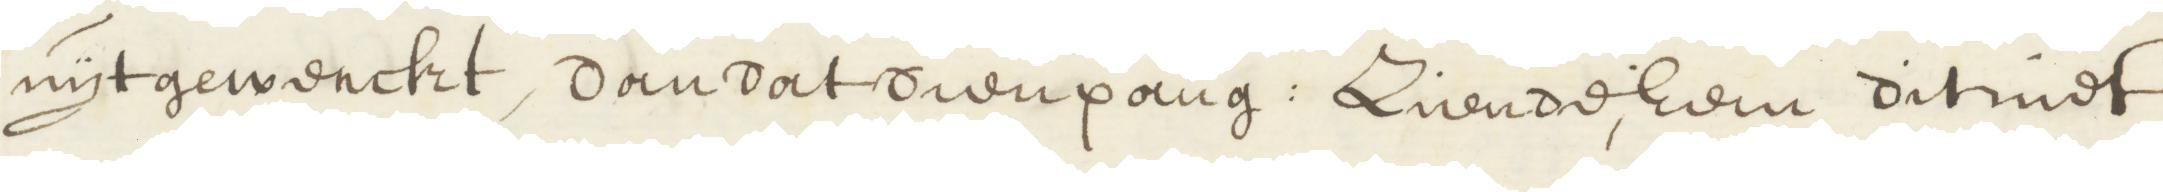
uijtgewerckt, dan dat dien pang: ziende, hem ditniet
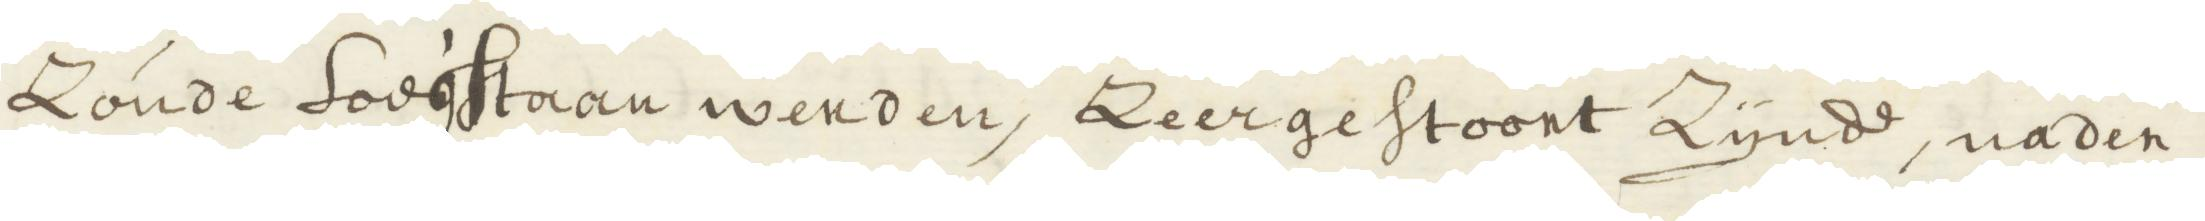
zoude toeg'staan werden, zeer gestoort zijnde, nader
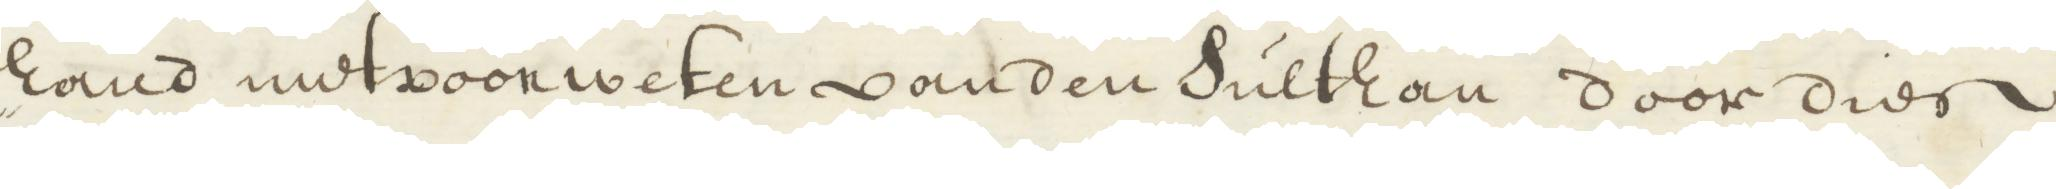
„hand met voorweten van den sulthan door dies
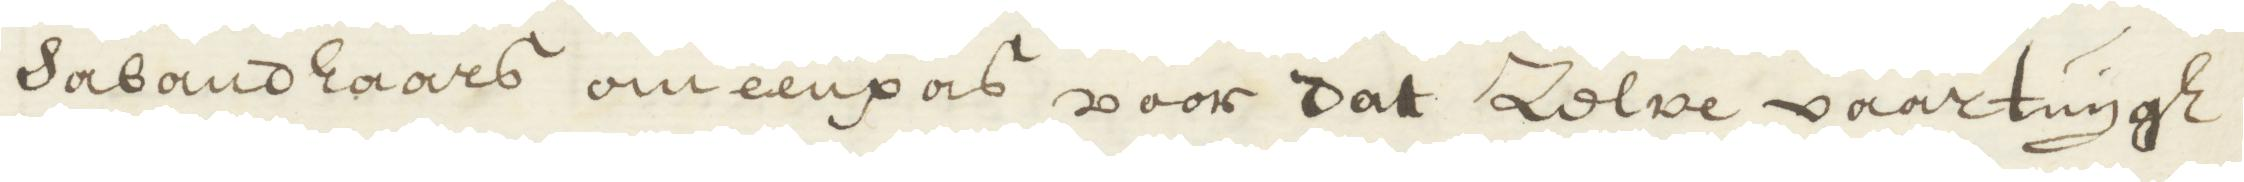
sabandhaars om eenpas voor dat zelve vaartuijgh
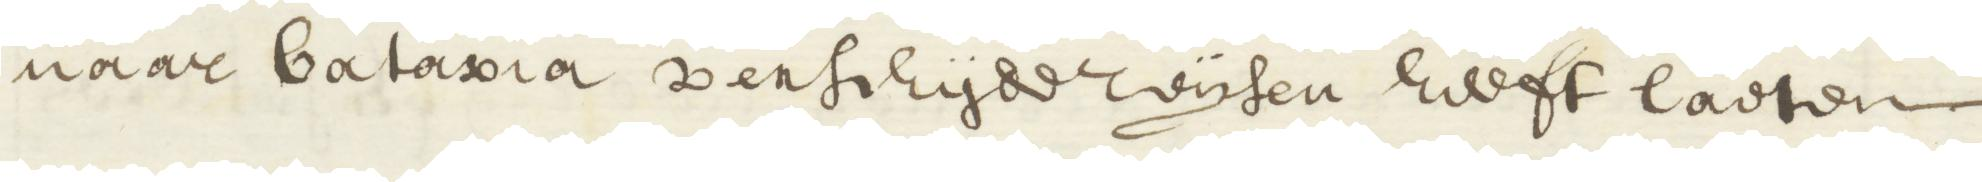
naar batavia verschijdereijsen heeft laeten
